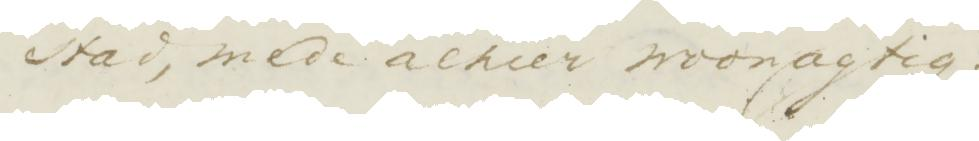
stad, mede alhier woonagtig.
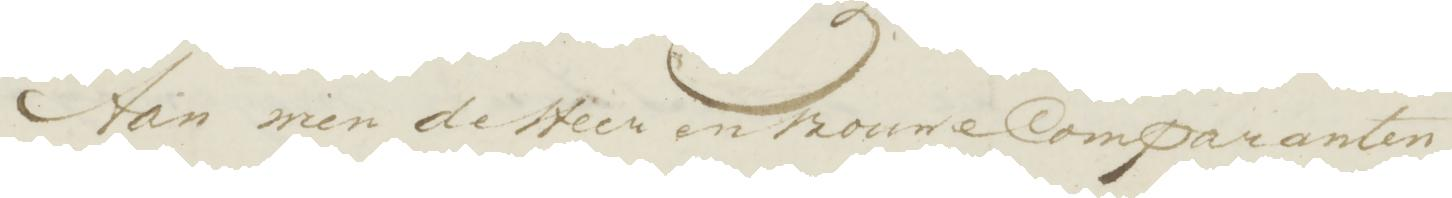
Aan wien de Heer en vrouwe Comparanten
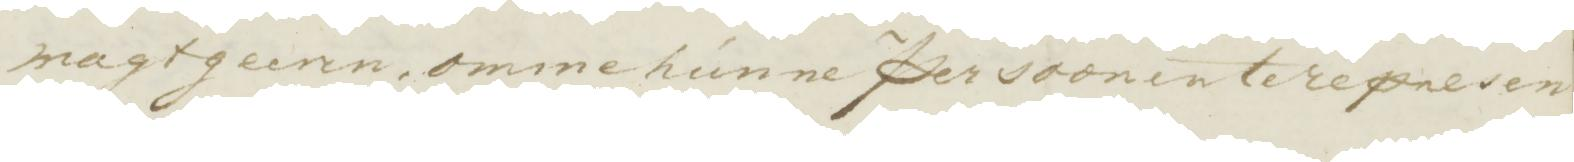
magt geeven, omme hunne Persoonen te represen
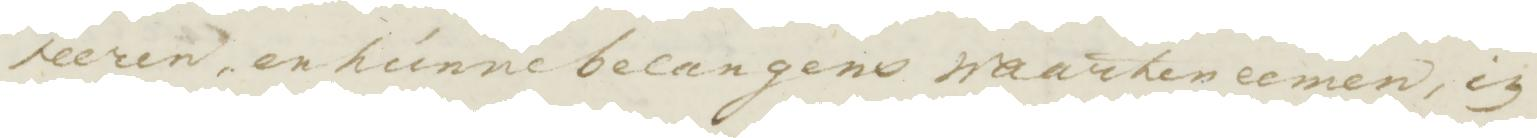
teeren, en hunne belangens waar te neemen, in
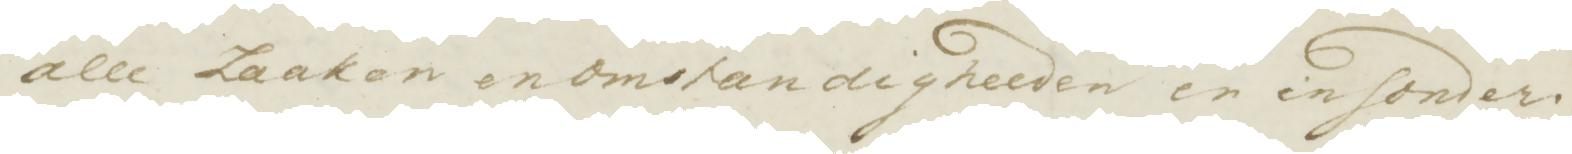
alle zaaken en omstandigheeden en insonder-
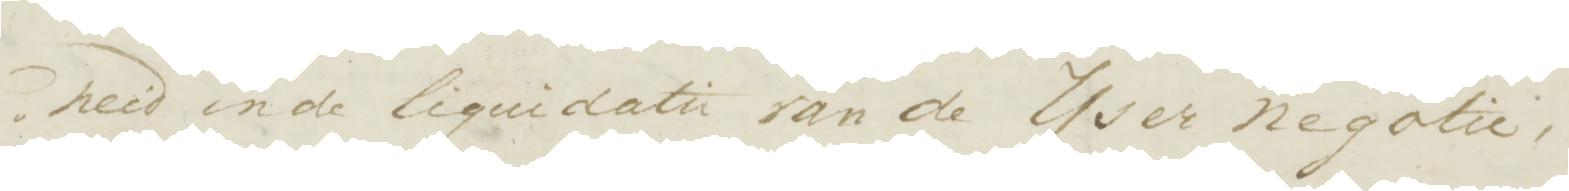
„heid in de liquidatie van de IJser negotie,
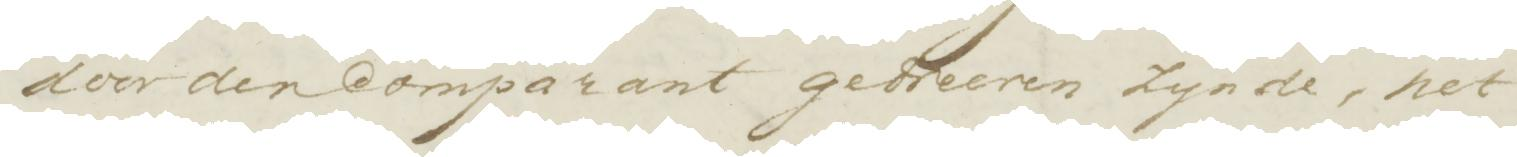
door den comparant gedreeven zynde, het
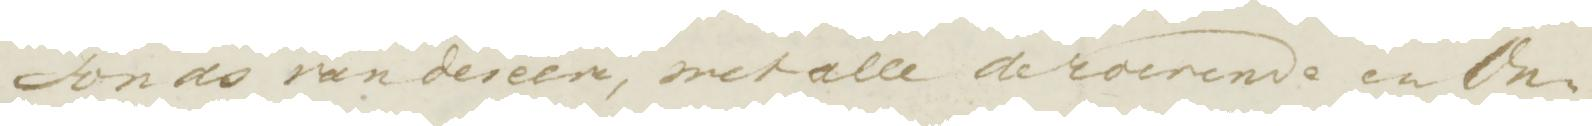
Fonds van deselve, met alle de roerende en On
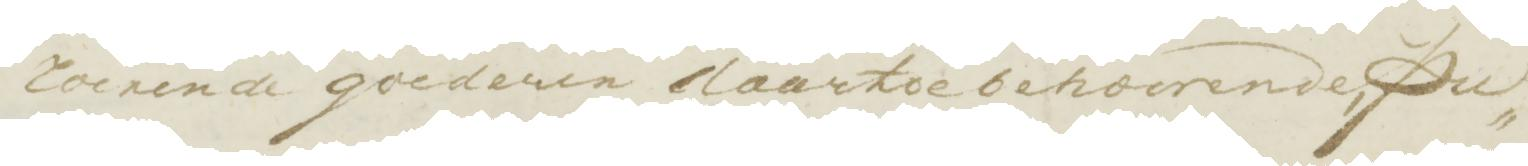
roerende goederen daartoe behoorende, Pu„
